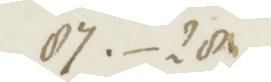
87. —28.
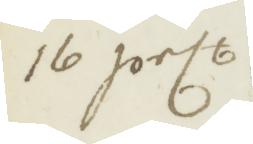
16 prct
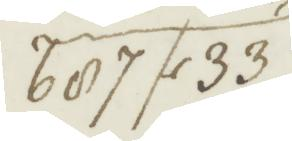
687 ƒ33
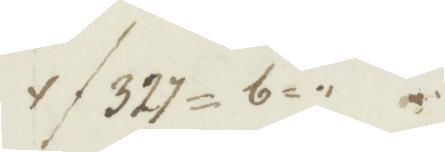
ƒ 327 = 6=.,
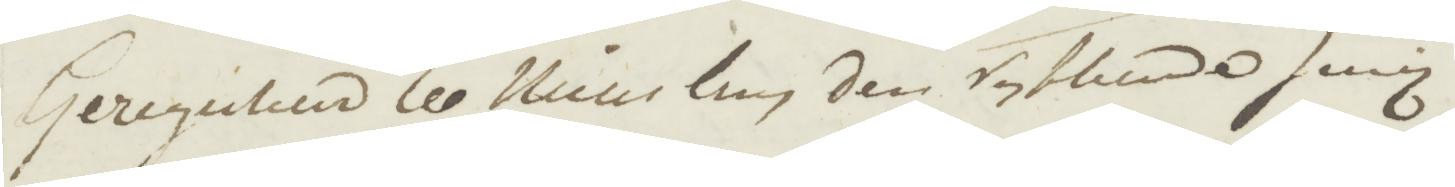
Geregisteerd te Haarlem den Vyftiende Junij
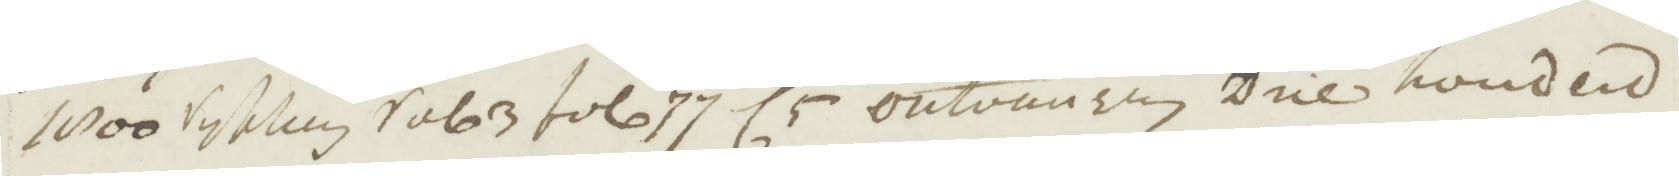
1800 Vyftien vol 3 fol 77 C5 ontvangen Drie honderd
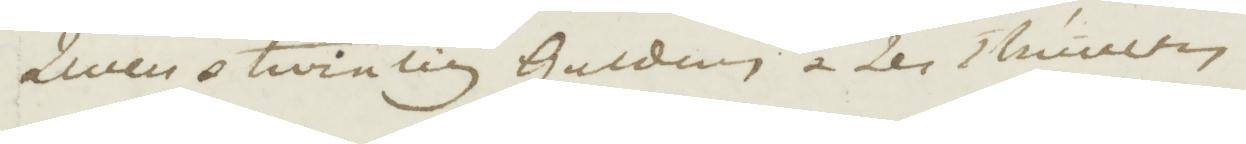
Zeven en twintig Guldens en zes stuivers
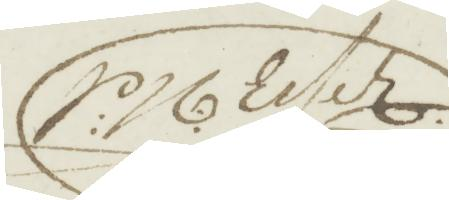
V:V. Eeser.
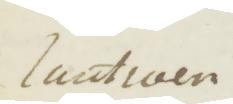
Rantsoen
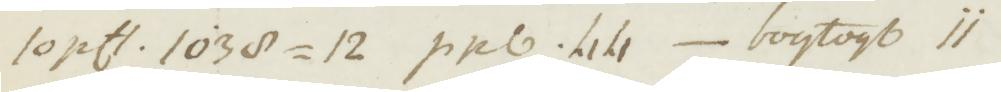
10 pct. 1038 =12 prc. 44 — borgtogt ii
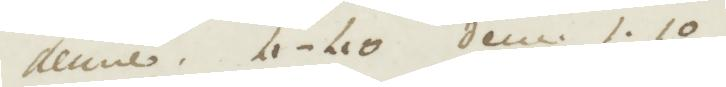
deune. 4-40 deun. 1. 10
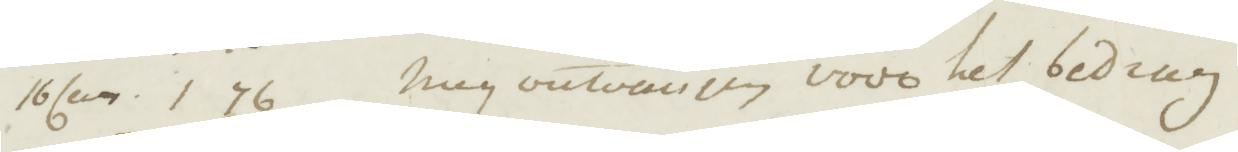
16 Cent. 1 76 Nog ontvangen voor het bedrag
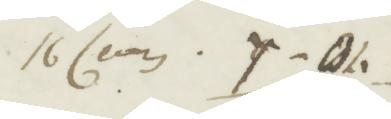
16 Cent. 7- 84
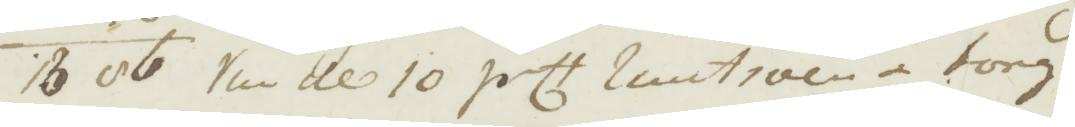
13 86 Van de 10 pct Rantsoen en borg
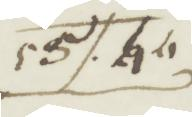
55 ƒ44
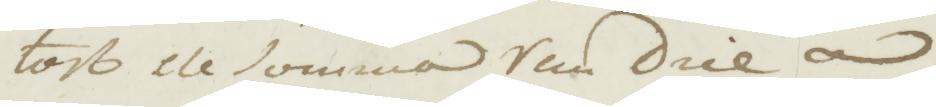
togt de somma van drie &
